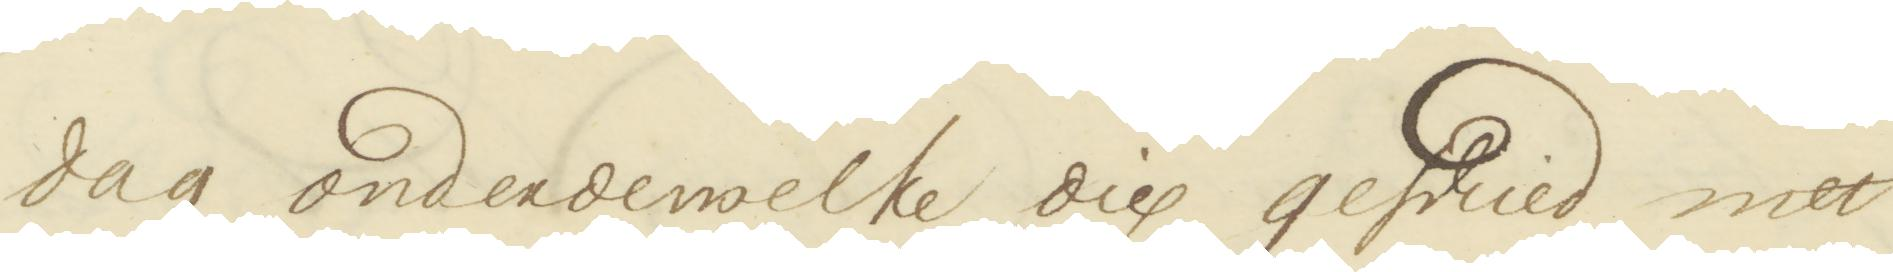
dag onderdewelke die geschied met
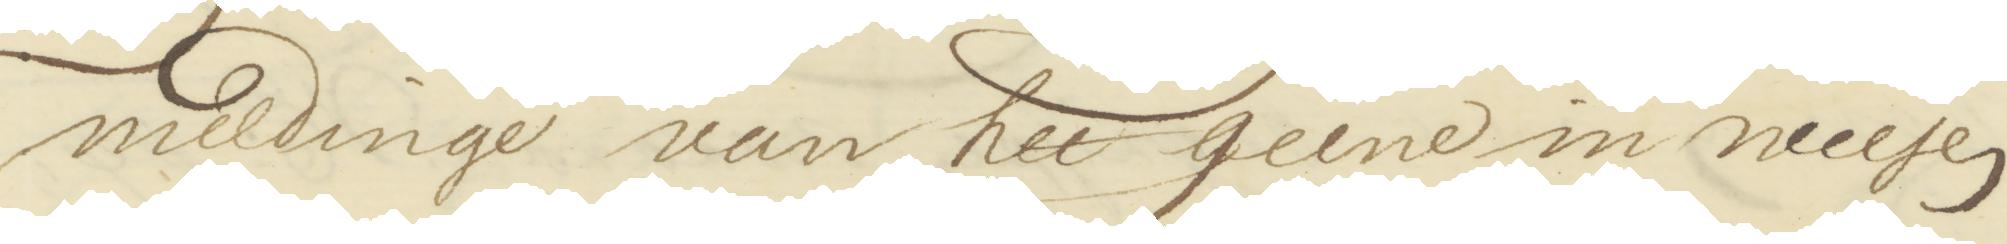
meldinge van het geene in weesen
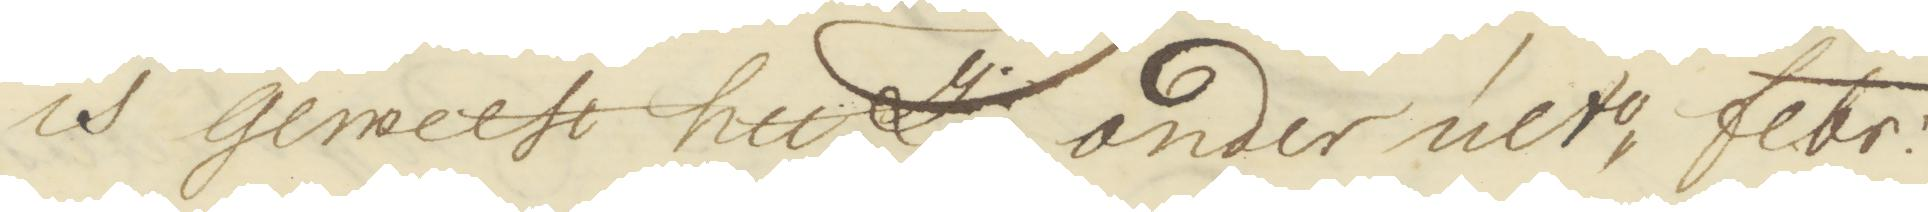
is geweest het zij onder ult„o febr:
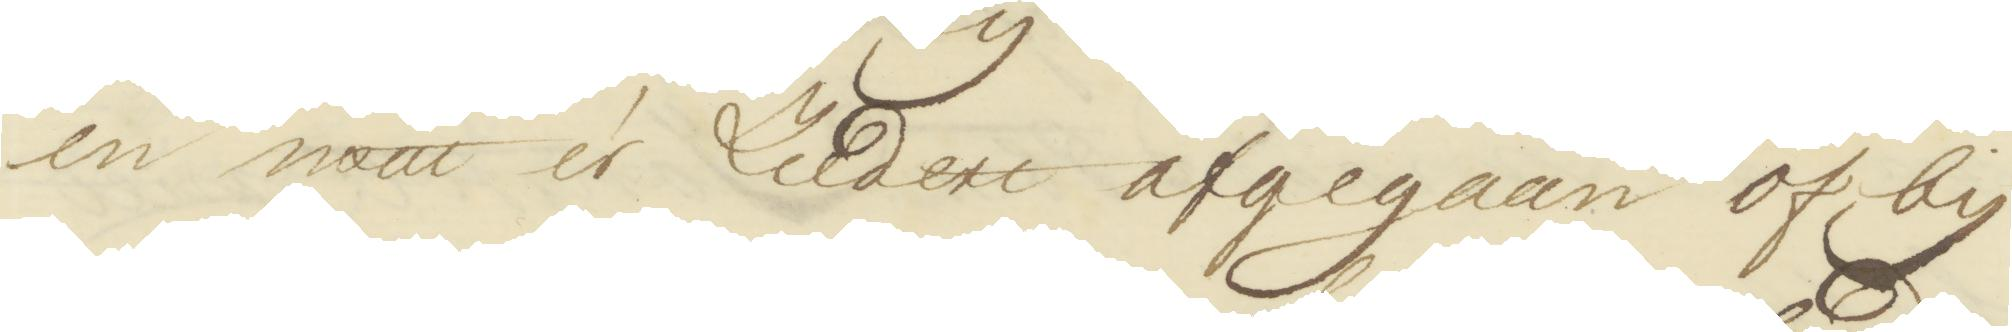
en wat 'er zeedert afgegaan of bij
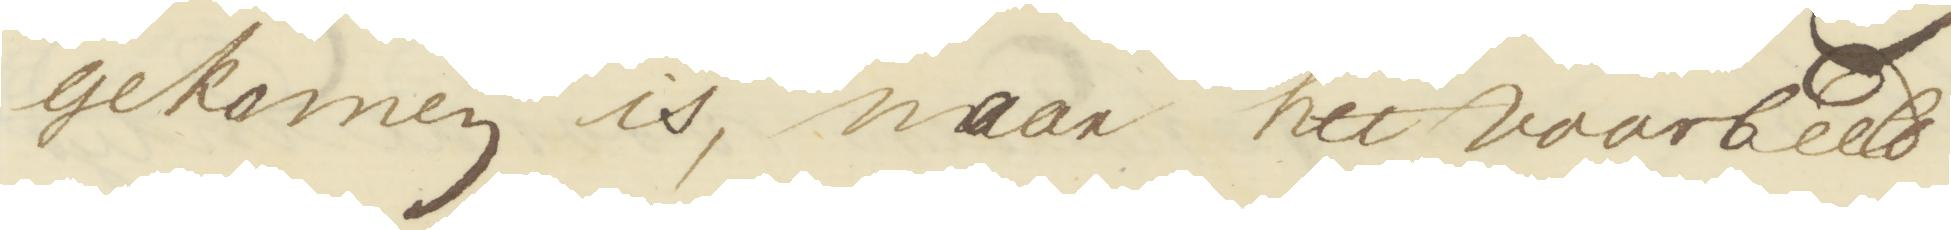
gekomen is, naar het voorbeeld
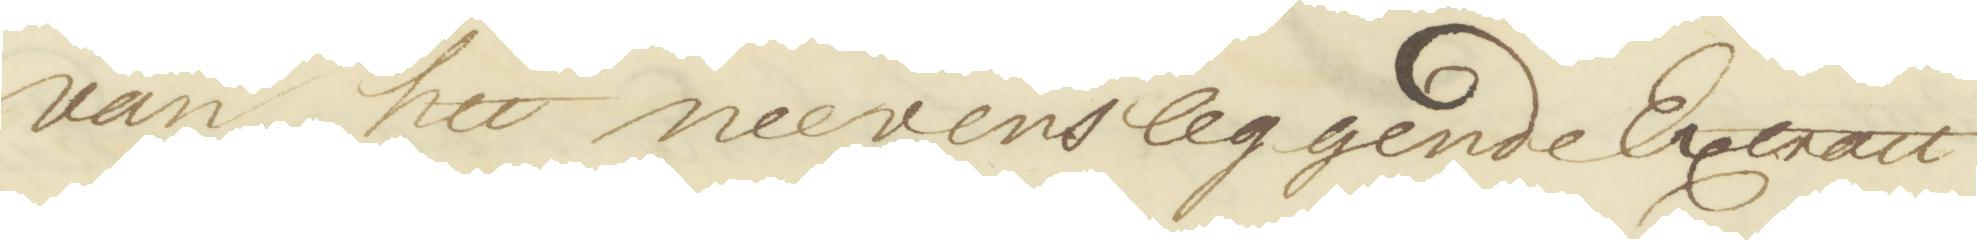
van het neevens leggende Extract
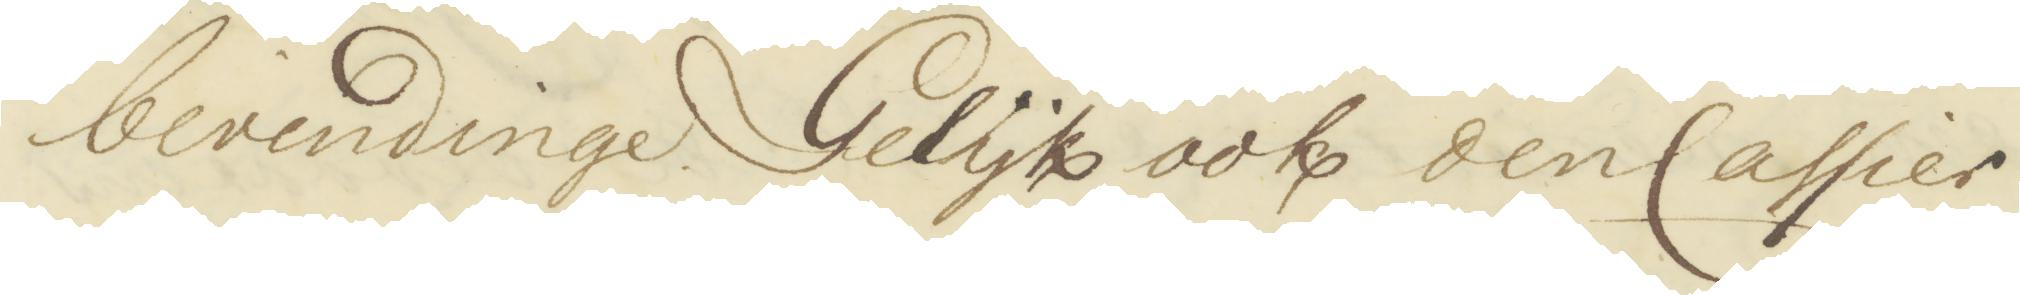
bevindinge Gelijk ook den Cassier
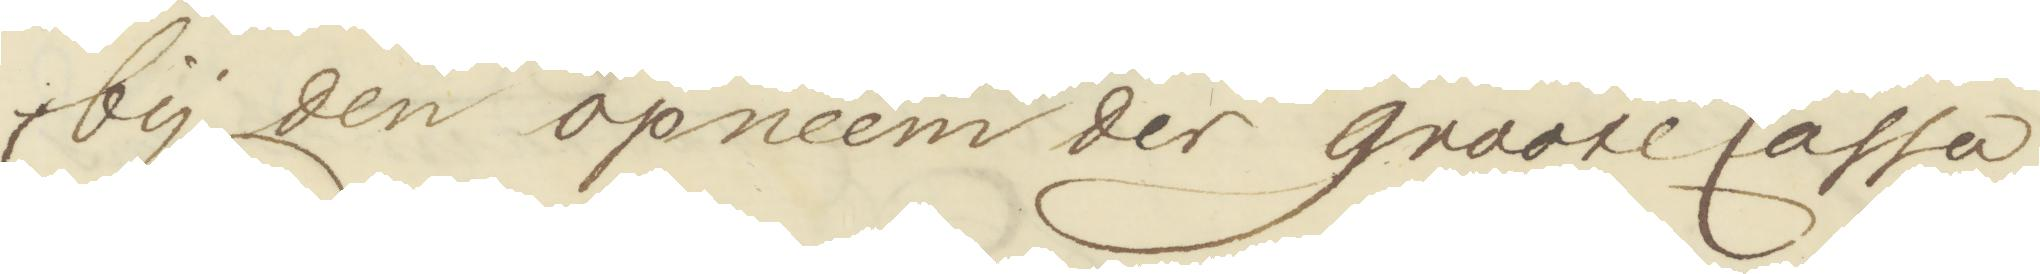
bij den opneem der groote Cassa,
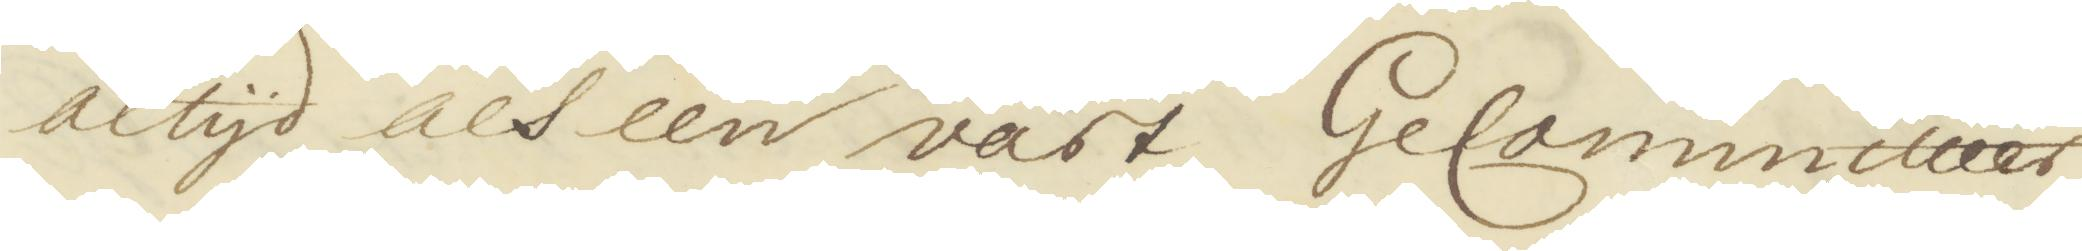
altijd als een vast Gecommitteer
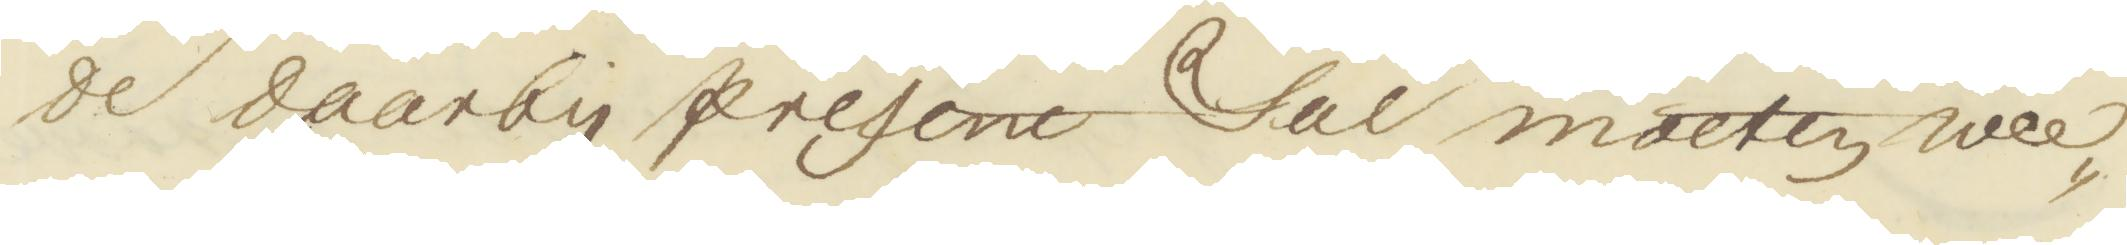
de daarbij present sal moeten wee„
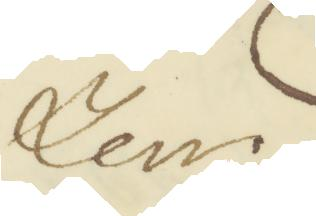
zen
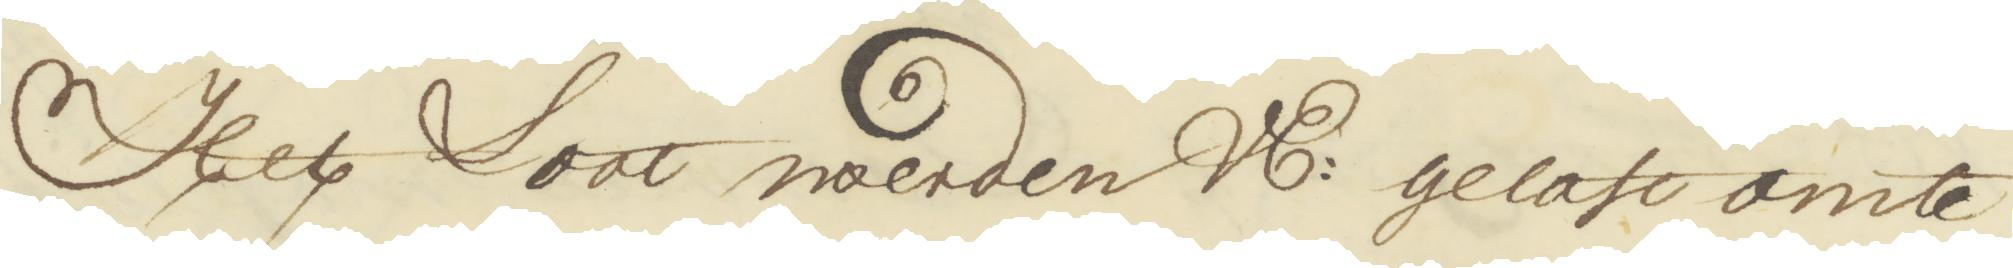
Het Laat werden VE: gelast omte
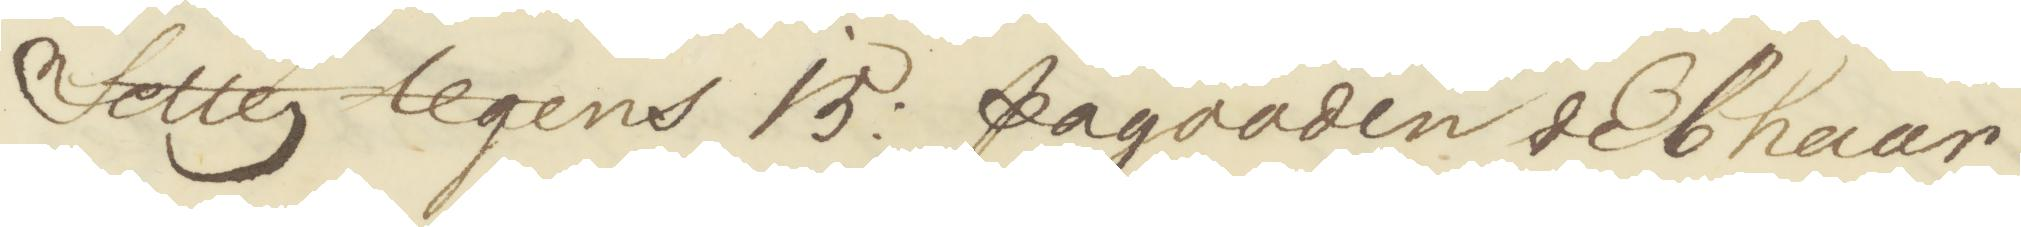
setten tegens 15: pagooden dEbhaar
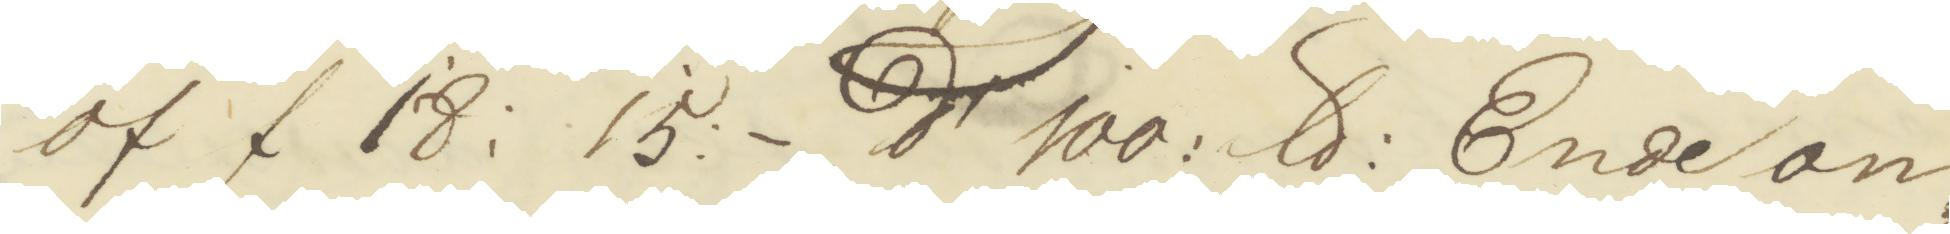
of ƒ 18: 15: — d' 100: lb: Ende on„
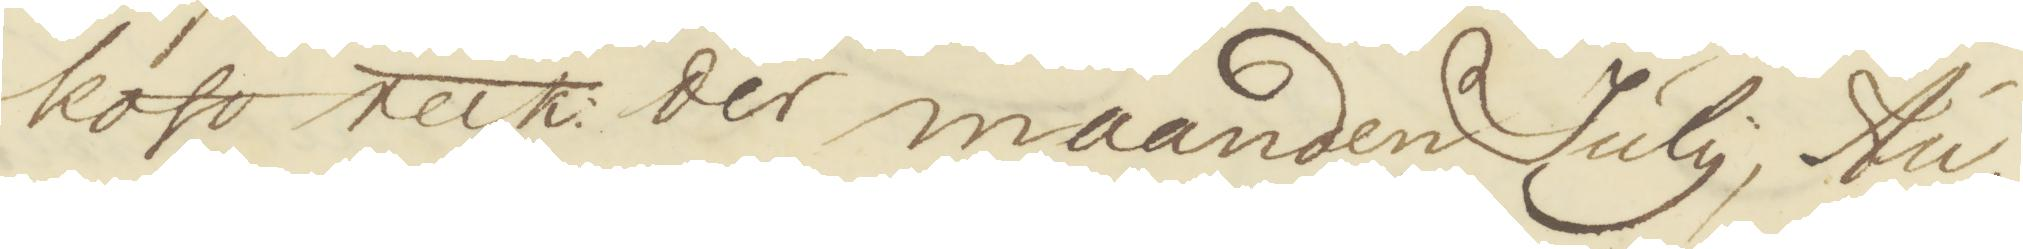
kost reek: der maanden Iulij, Au„
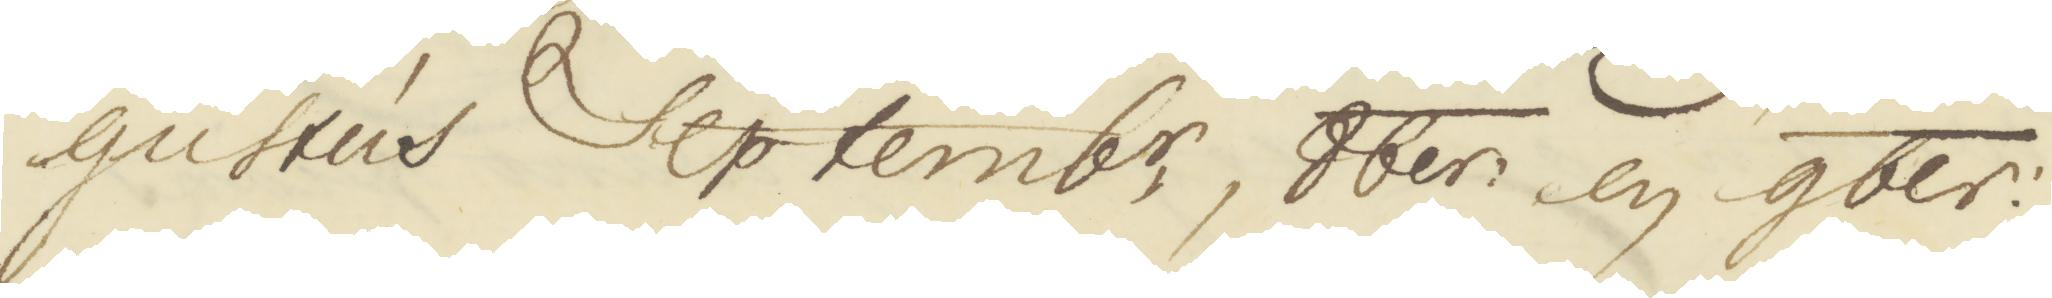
gustus Septemb„r 8ber: en 9ber:
